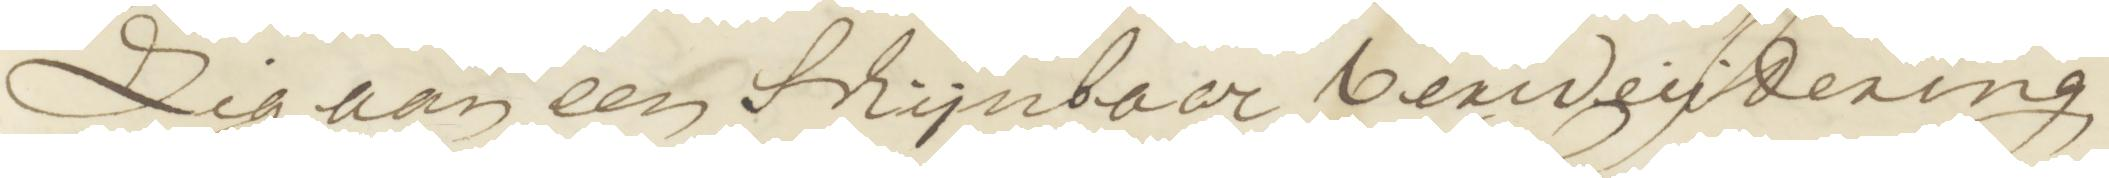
zig aan een schijnbaer verweijdering,
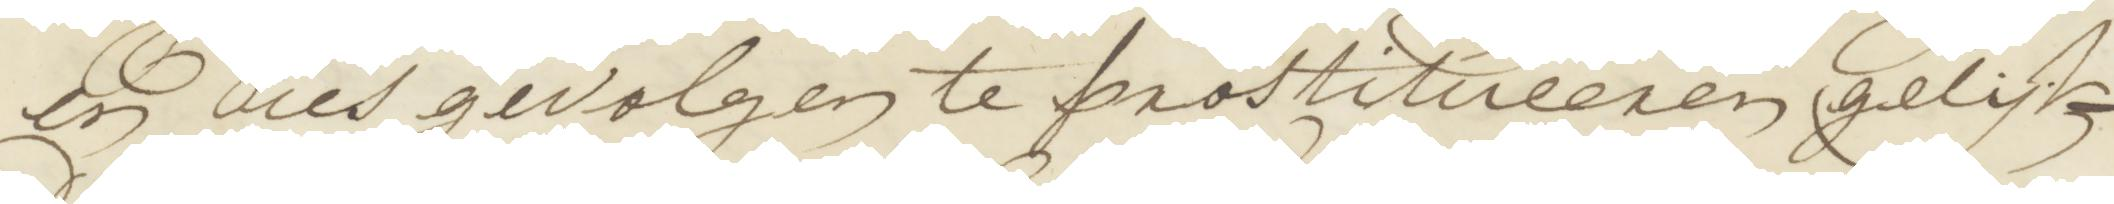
en dies gevolgen te prostitueeren gelijk
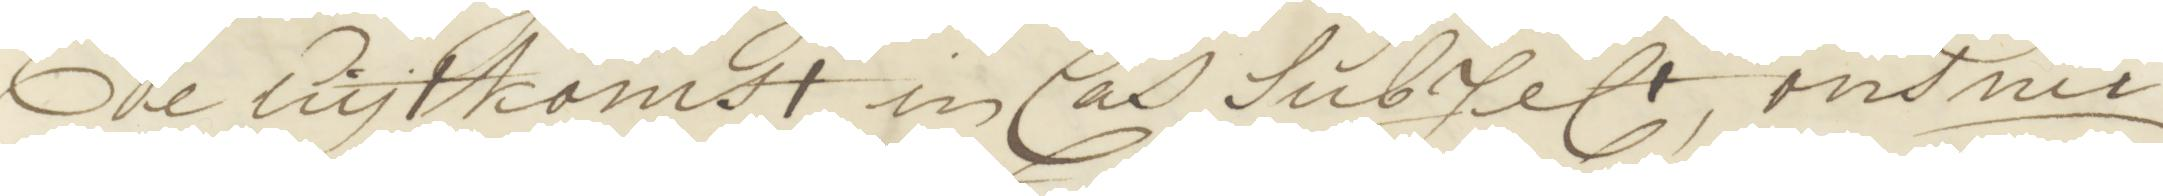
de uijtkomst in Cas subject, ons nu
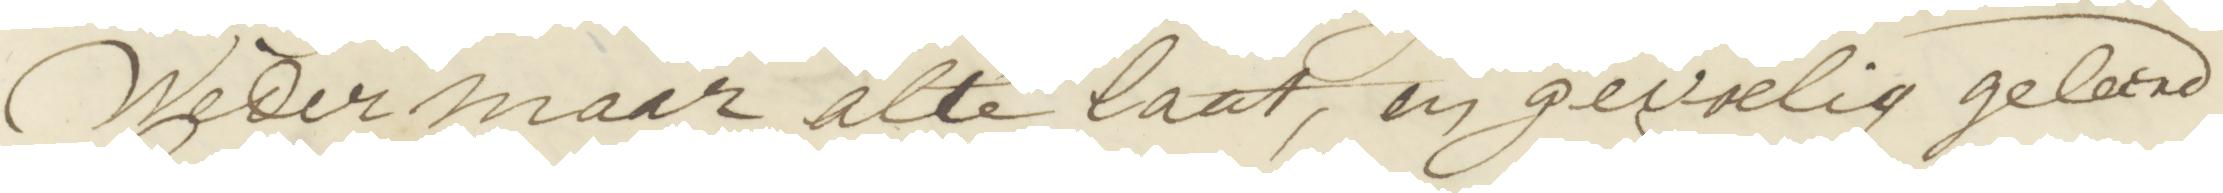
weder maar alte laat, en gevoelig geleerd
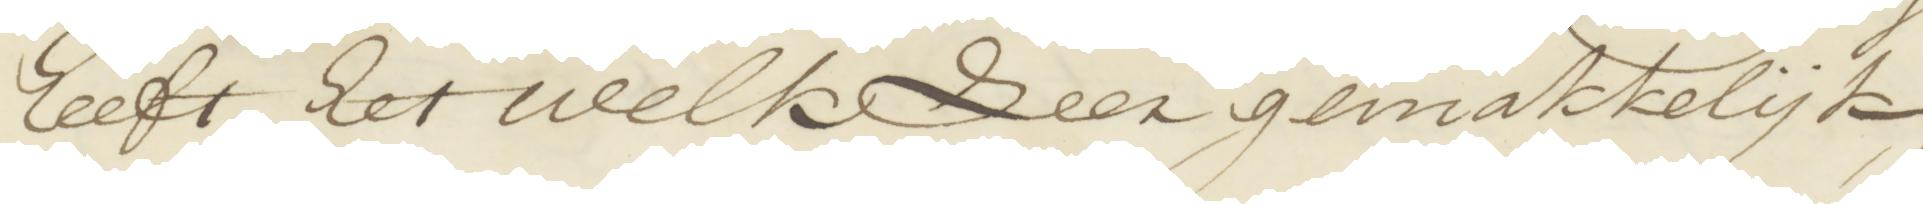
heeft het welk Zeer gemakkelijk
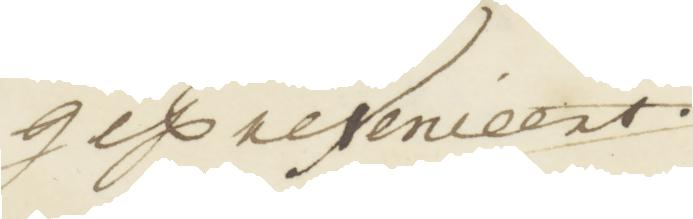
geprevenieert.
